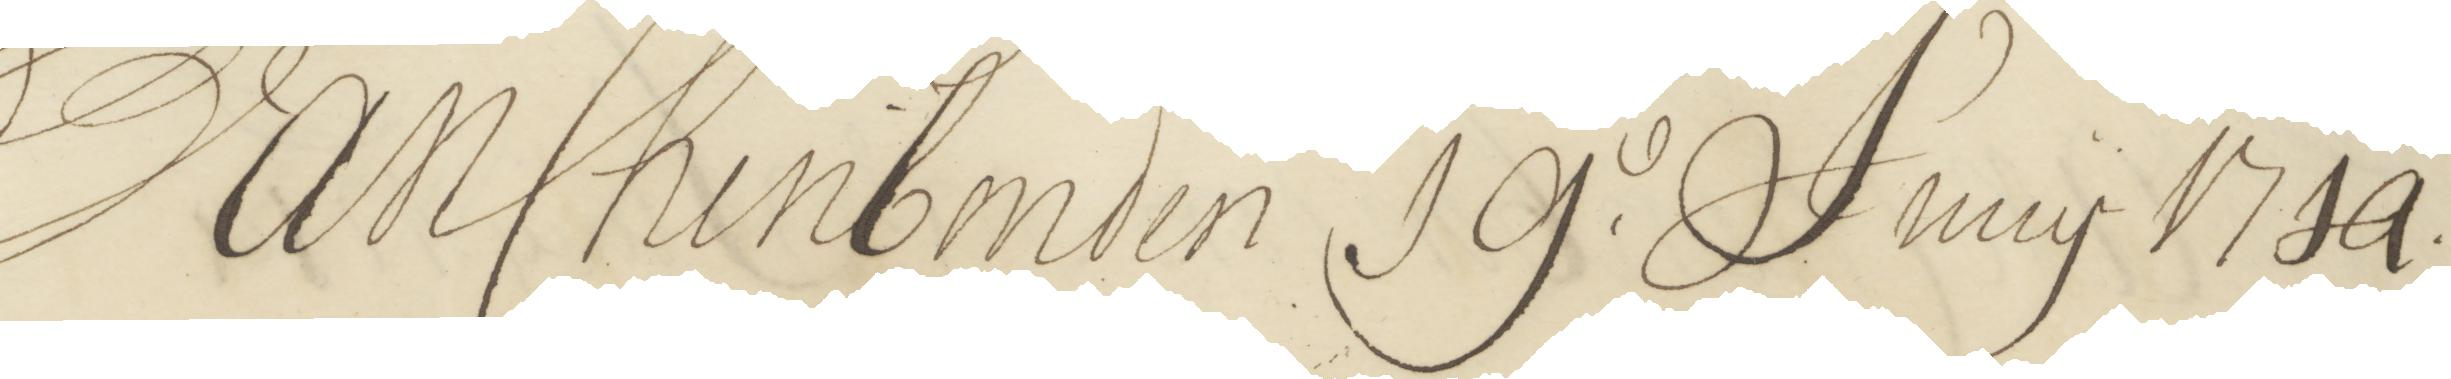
Van Cheribon den 19:e Junij 1714.
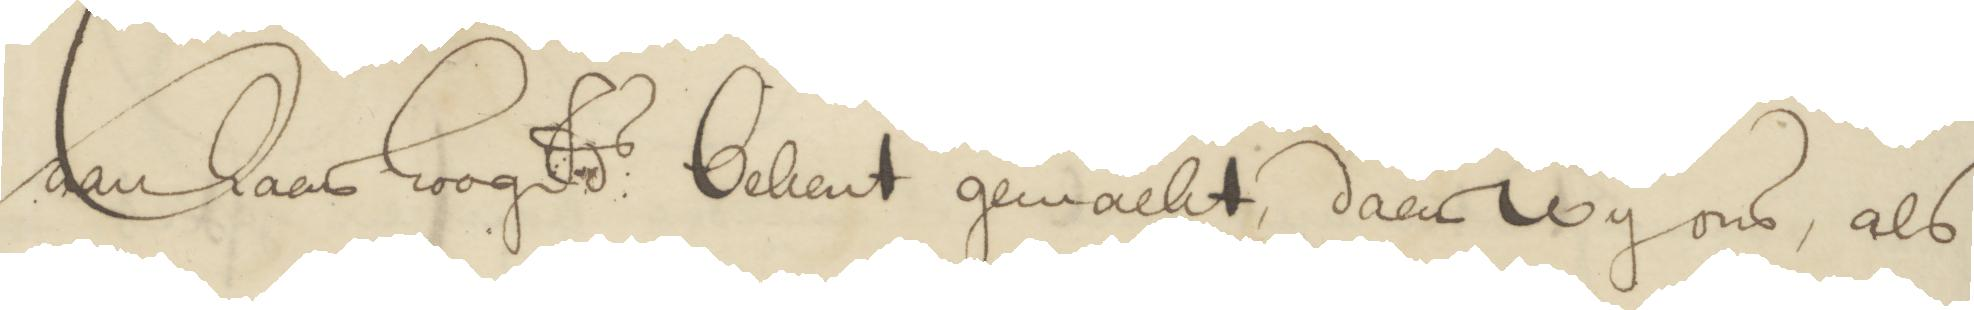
aan haar hoog Ed:s bekent gemaekt, daar wij ons, als
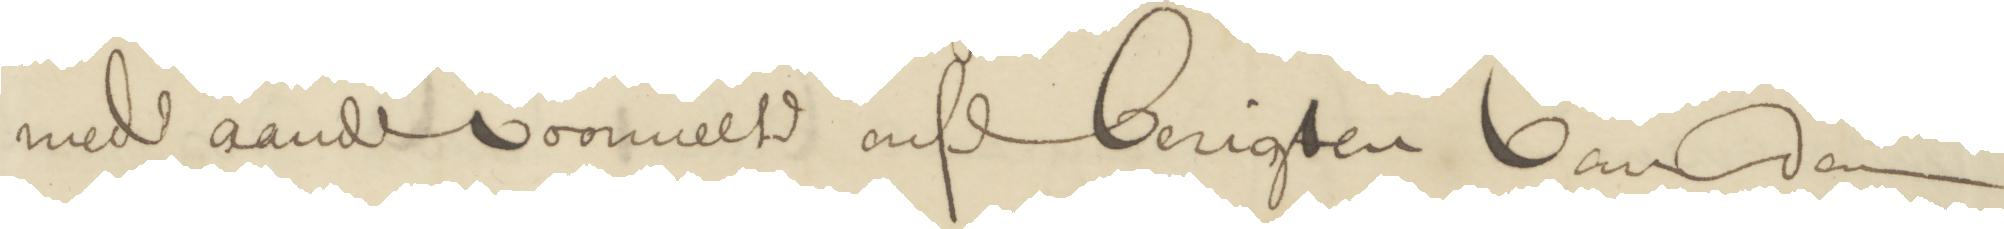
mede aande voormelte onse berigten van den
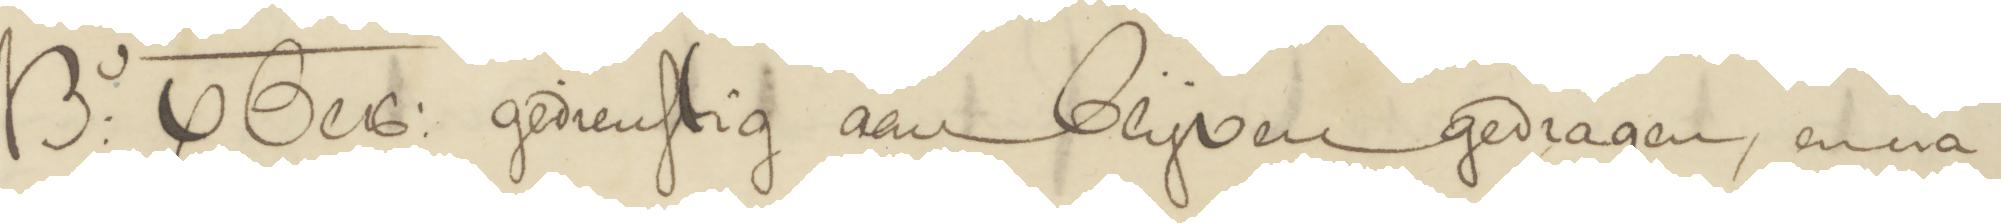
13:e xber: gedienstig aan blijven gedragen, en na
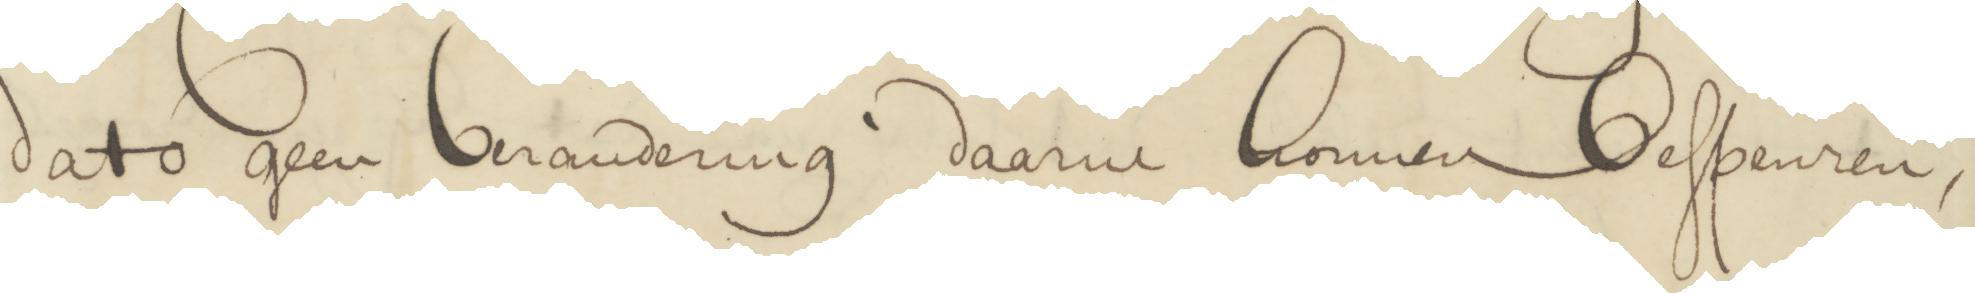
dato geen verandering daarin konnen bespeuren,
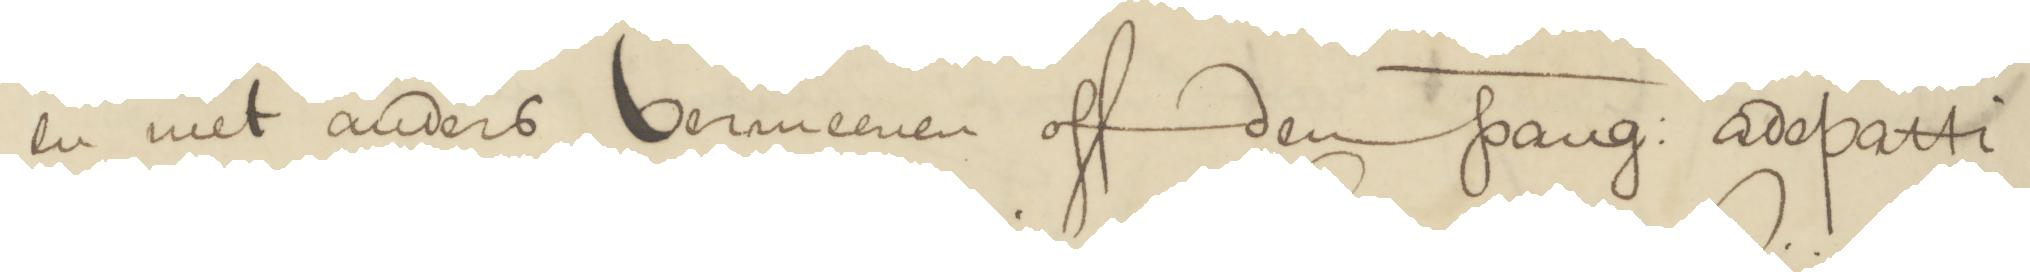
en niet anders vermeenen off den pang: adepatti
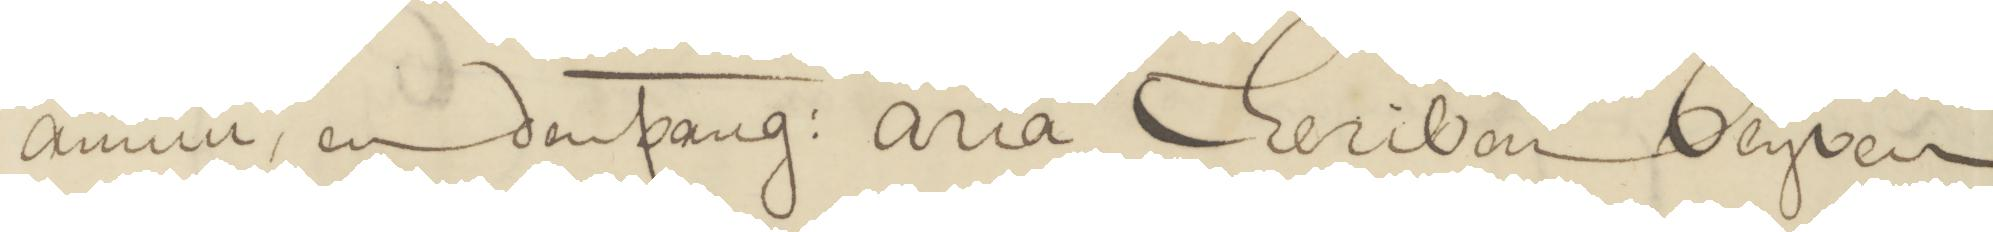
anum, en den pang: aria Cheribon blijven
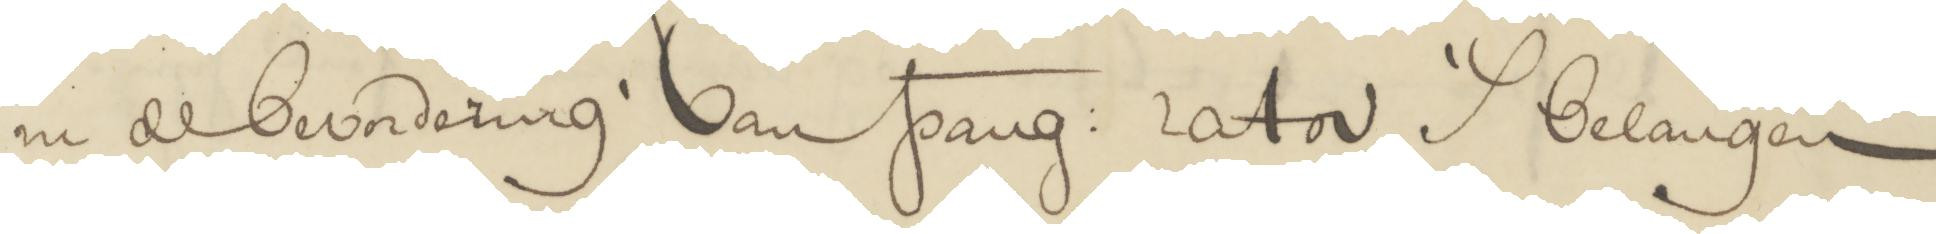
in de bevordering' van pang: ratoe 's belangen
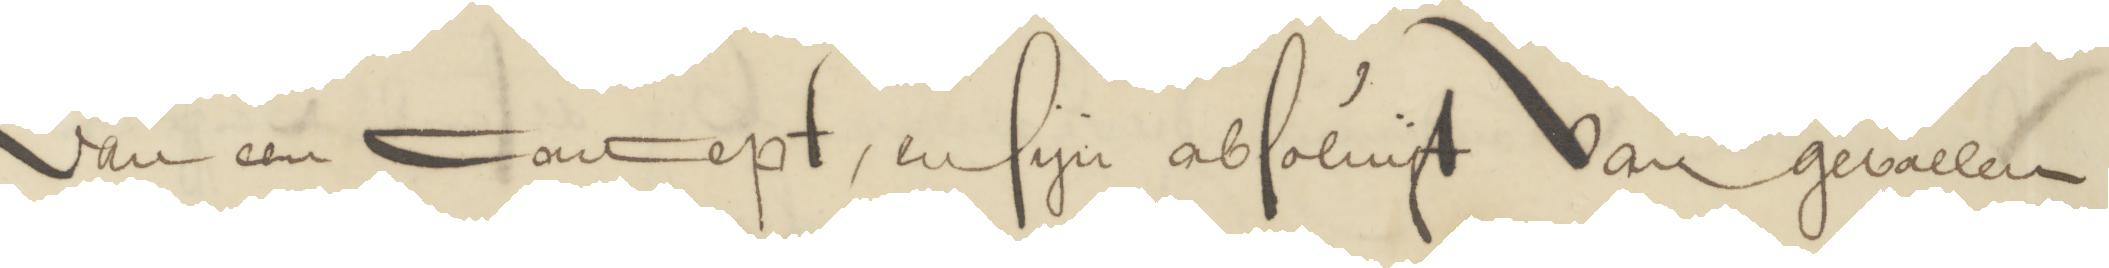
van een concept, en sijn absoluijt van gevallen
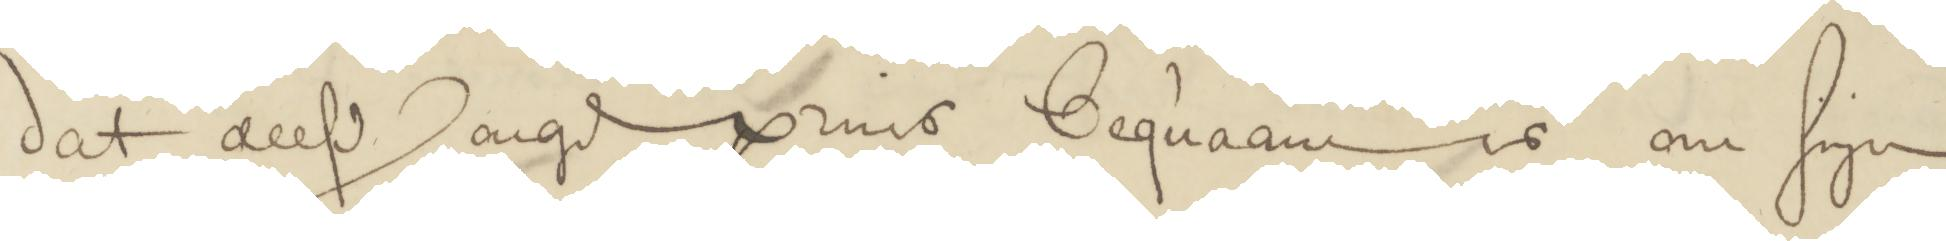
dat deese Jonge prins bequaam is om sijn
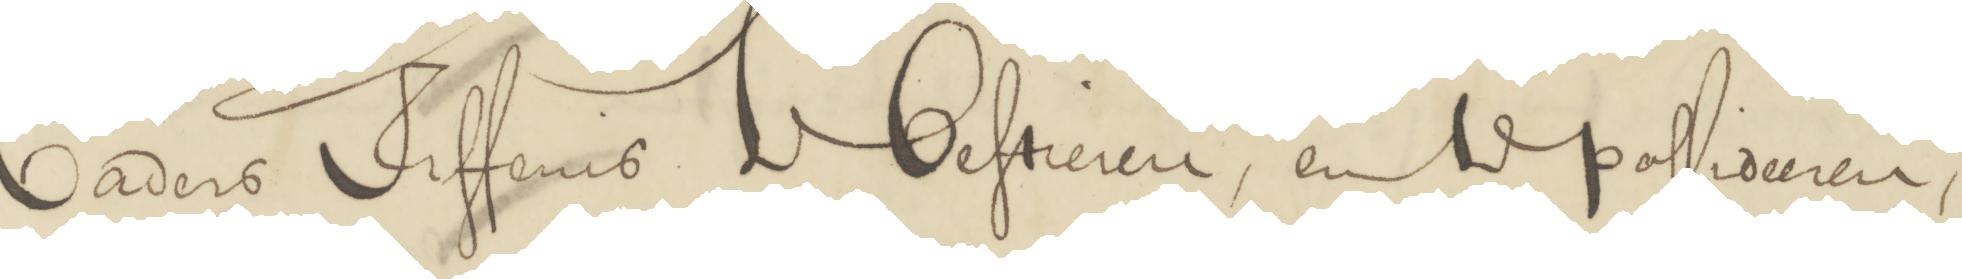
vaders Erffenis te bestieren, en te possideeren,
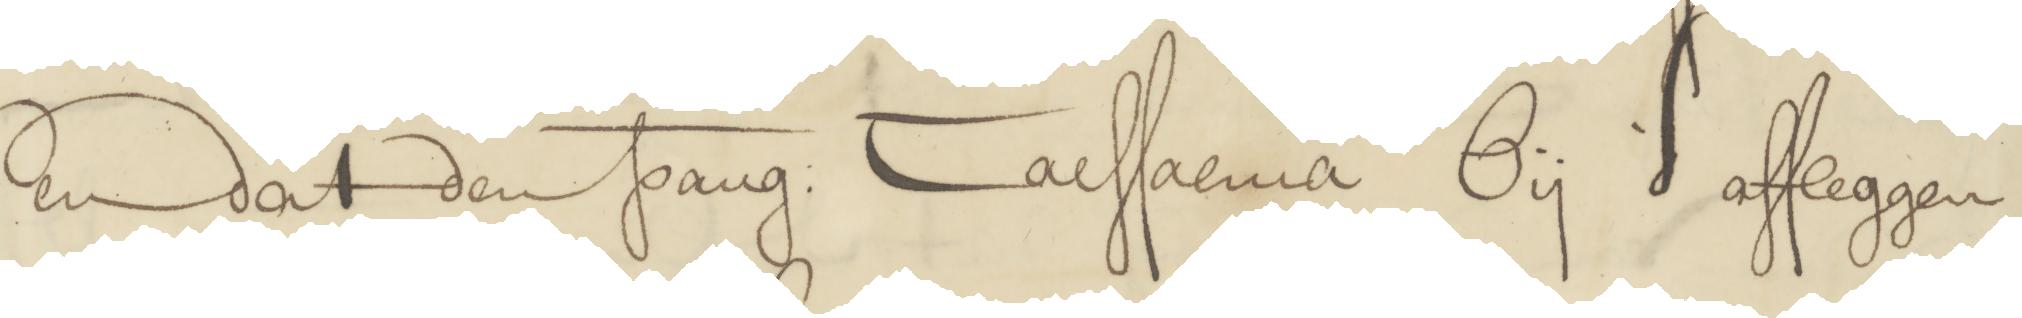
en dat den pang: coessoema bij 't affleggen
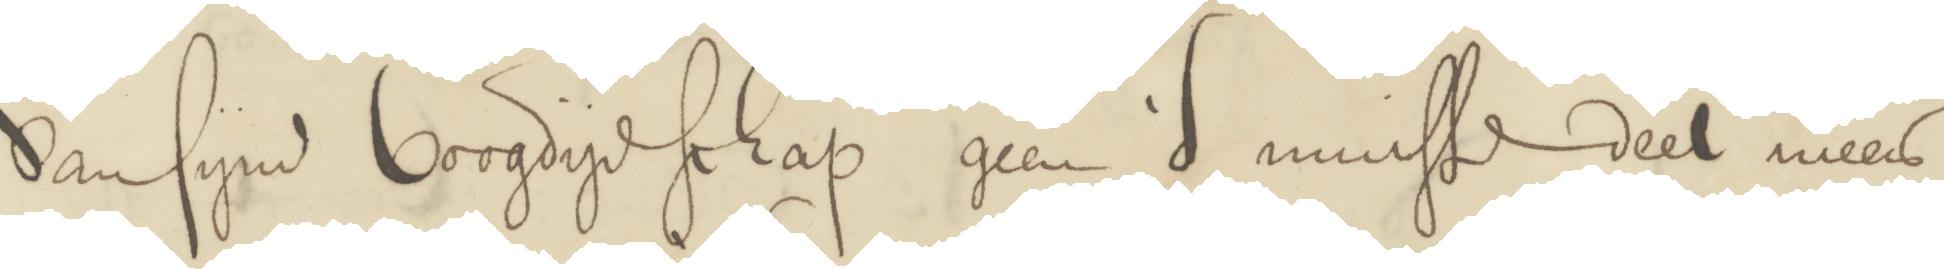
dan sijne voogdijeschap geen ’t minste deel meer
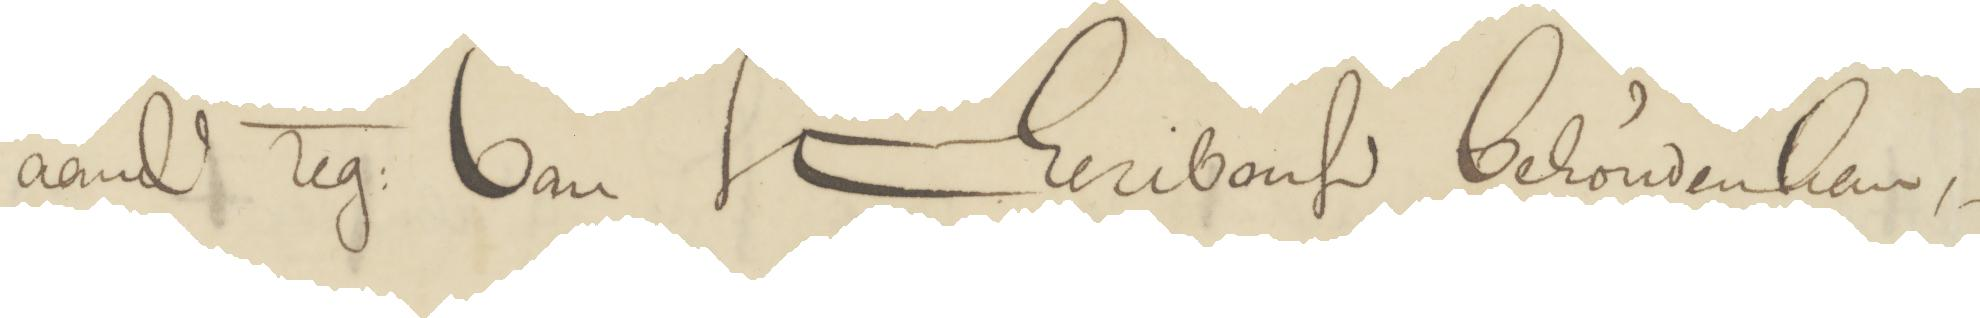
aande reg: van t cheribonse behouden kan,
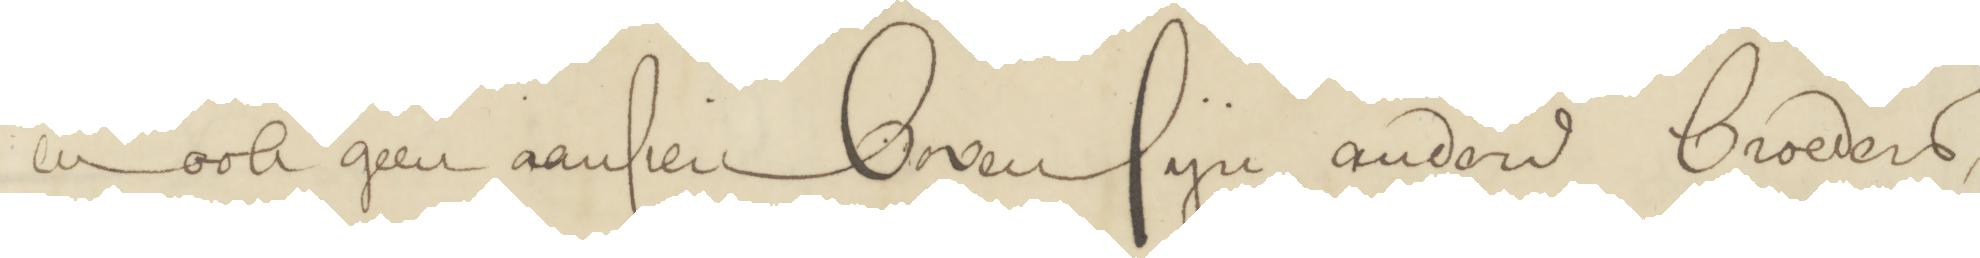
en ook geen aansien boven sijn andere broeders
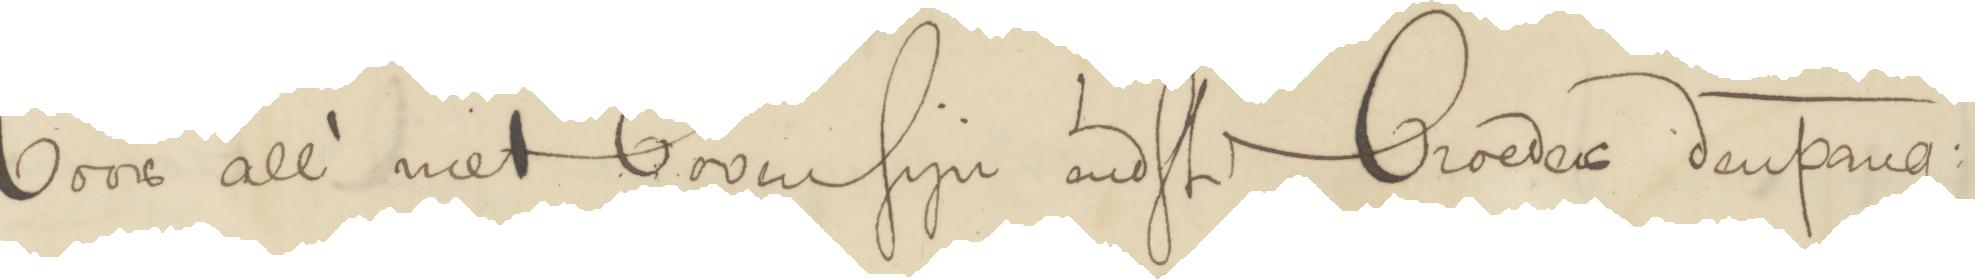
voor all' niet boven sijn oudste broeder den pang:
